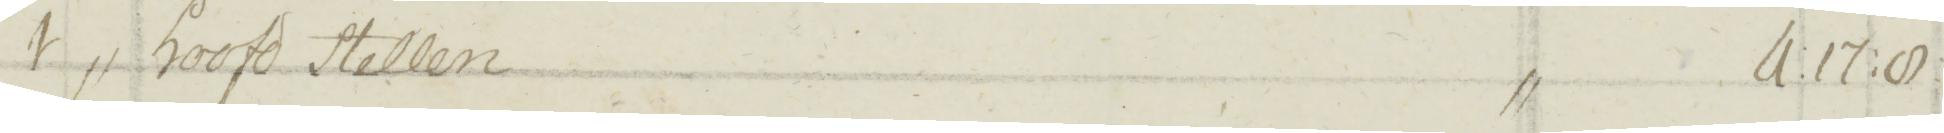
1 „ hoofd stellen „ 4:17:8
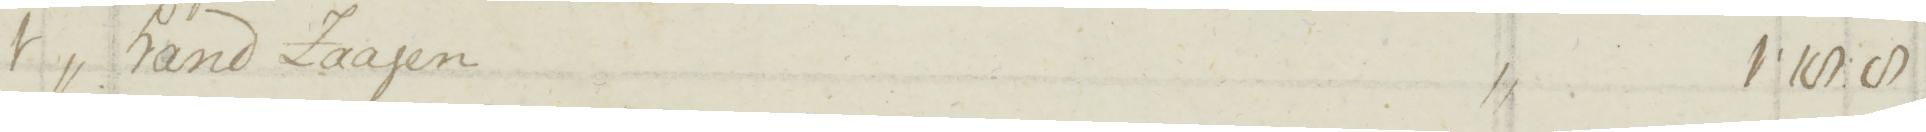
1 „ hand Zaagen „ 1:18:8
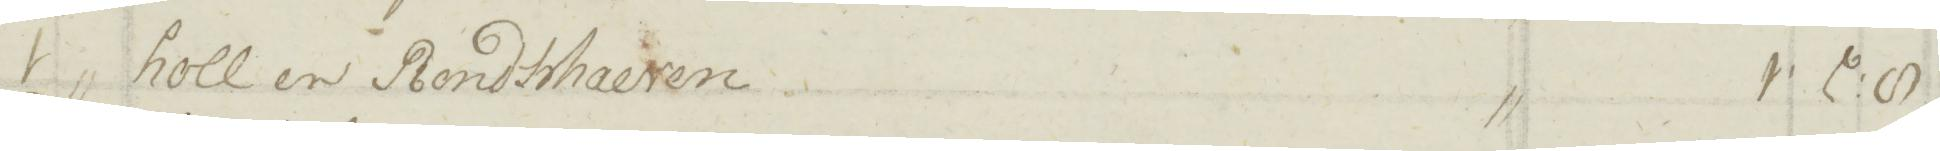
1 „ holl en Rondschaeven „ 1:5:8
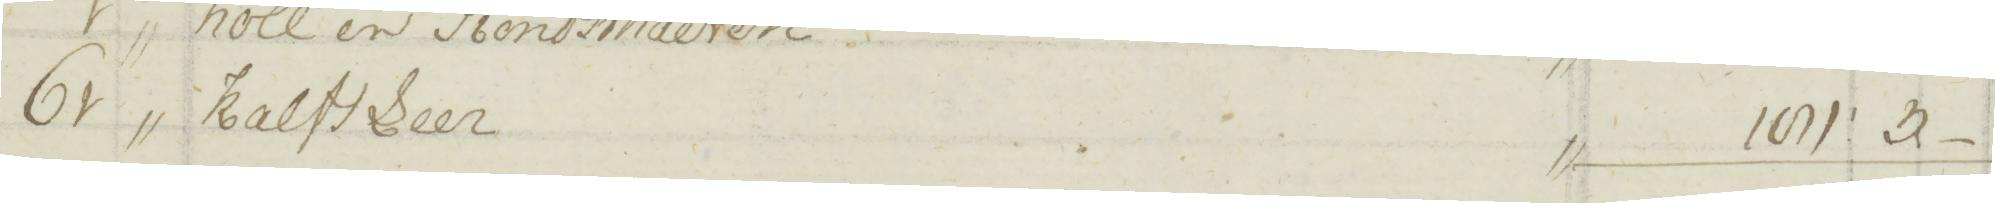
61 „ kalfsleer „ 181:3._
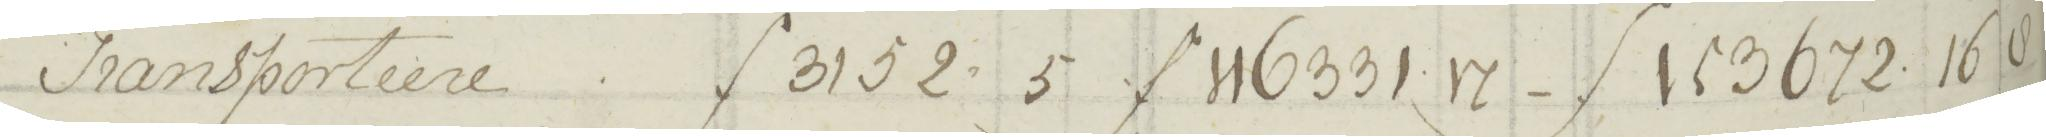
Transporteere ƒ 315'2: 5 ƒ 116331.17 - ƒ 153672.168
